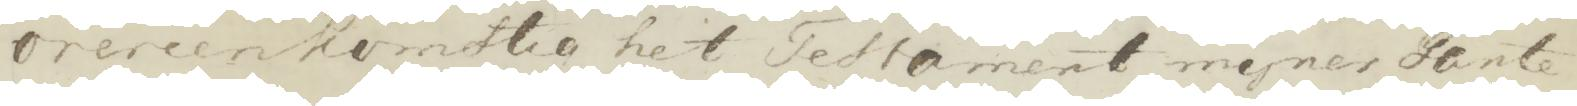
overeenkomstig het Testament myner Tante
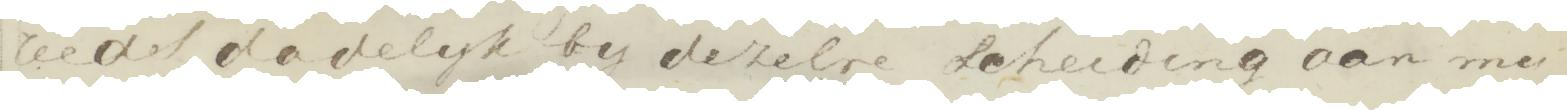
reeds dadelyk by dezelve scheiding aan my
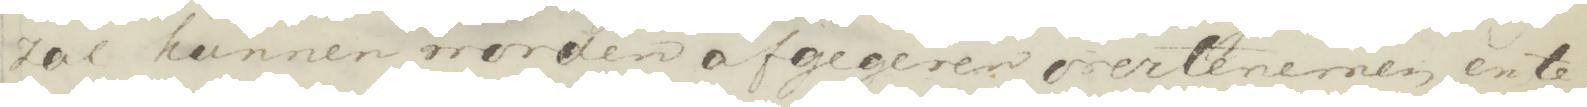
zal kunnen worden afgegeven overtenemen en te
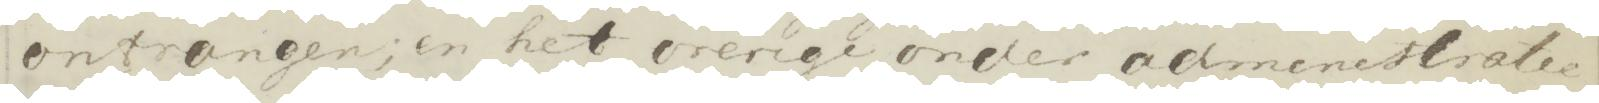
ontvangen; en het overige onder administratie
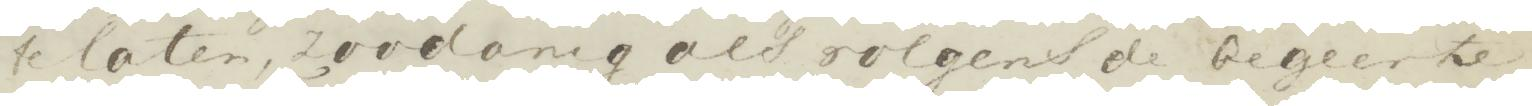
te laten, zoodanig als volgens de begeerte
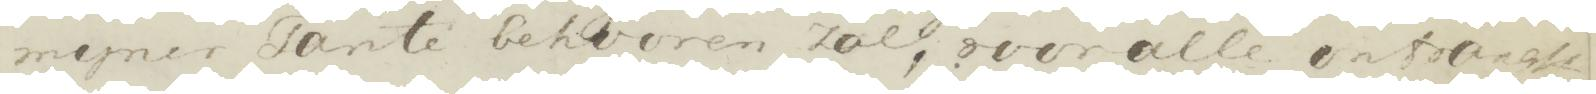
myner Tante behooren zal, voor alle ontvangst
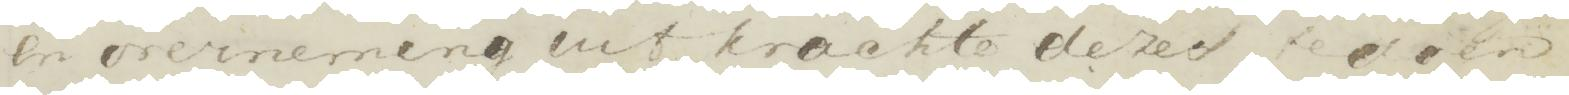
en overneming uit krachte dezes te doen
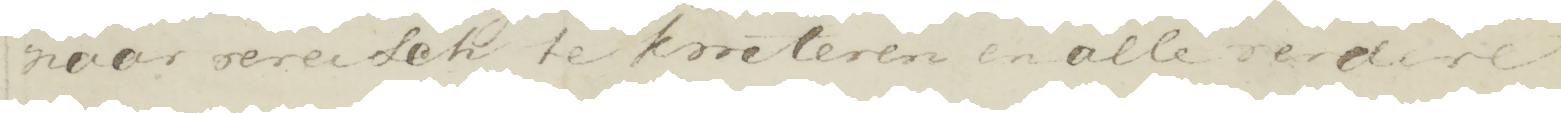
naar vereisch te kwiteren en alle verdere
